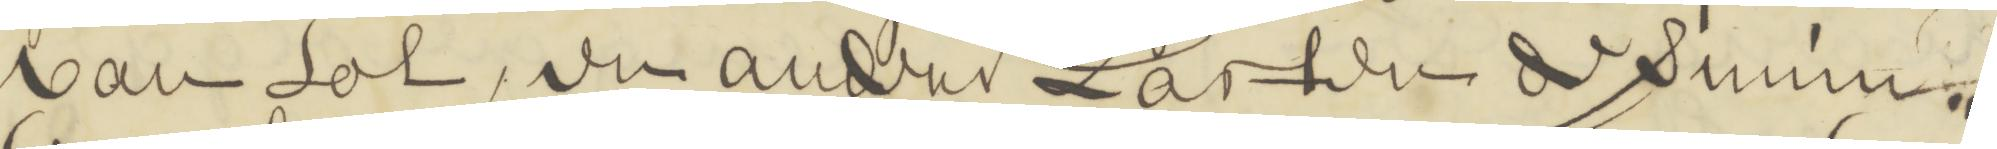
van tol, en andere lasten de vermun„
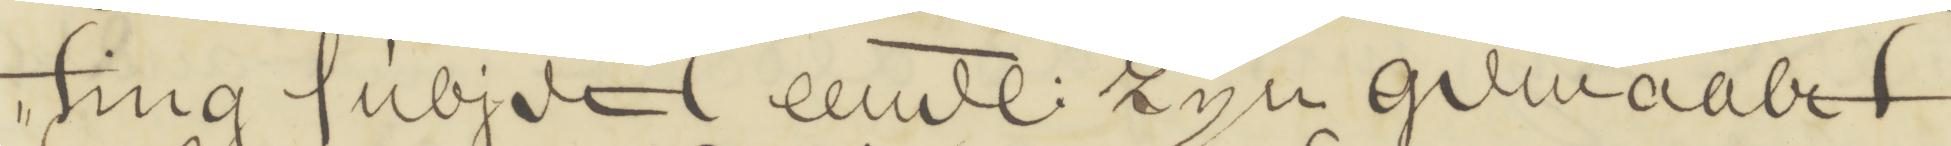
„ting subject eenelijk zijn gemaakt
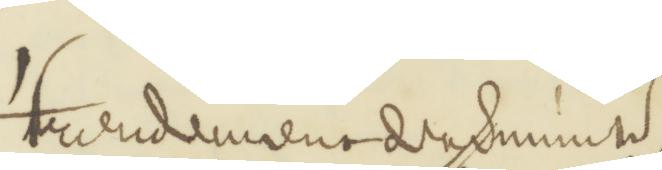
'trendement der vermunte
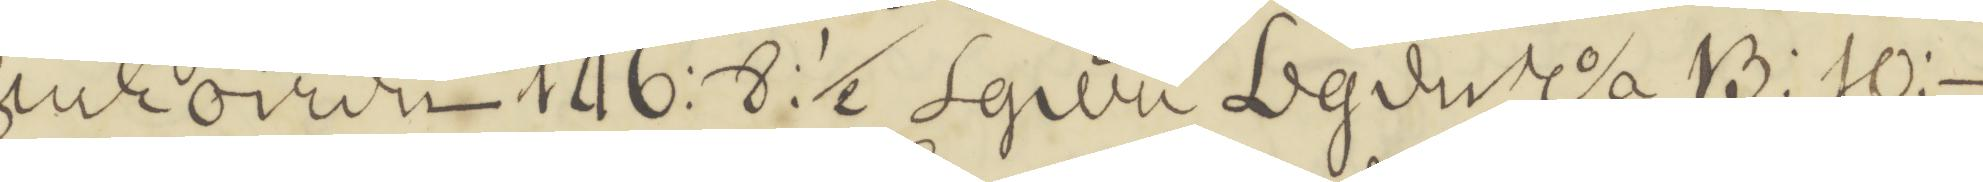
inhoiren 146: 8: ½ 'tgeen tegen ro/a 13.10:–
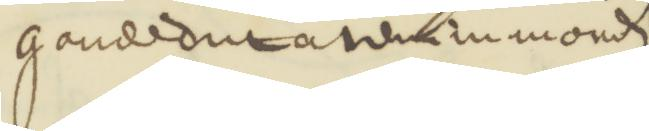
goude ducaten in moren
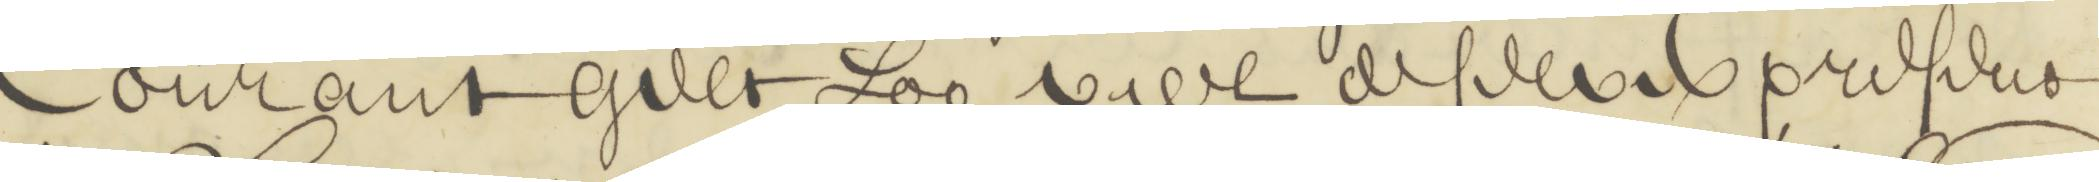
Courant gelt soo veel deselve present
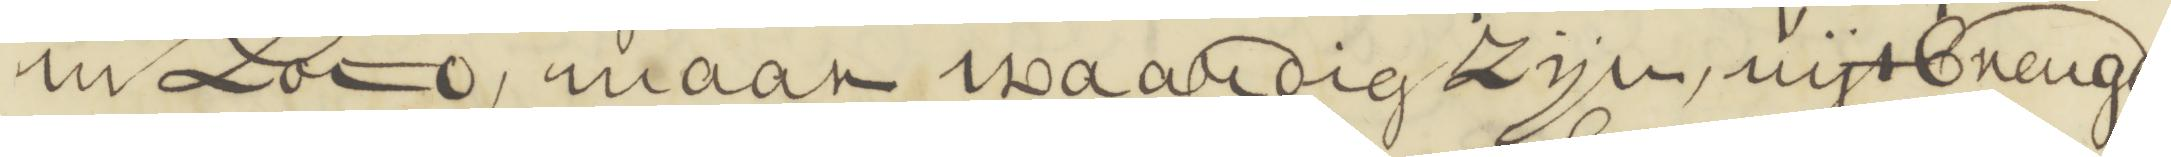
in Loco, maar waardig zijn, uijtbrengd
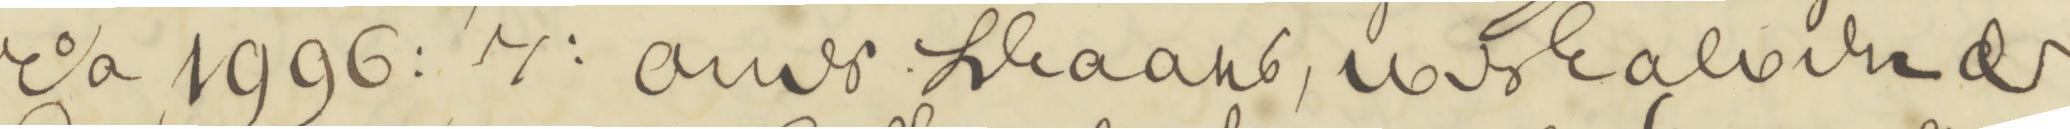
ro/a 1996: 7: anes schaars, weshalven de
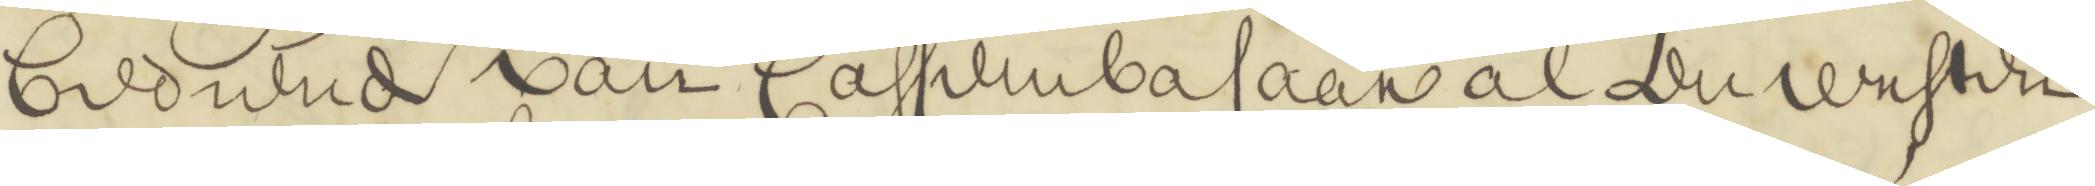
bediende van Cassembasaar al ten eersten
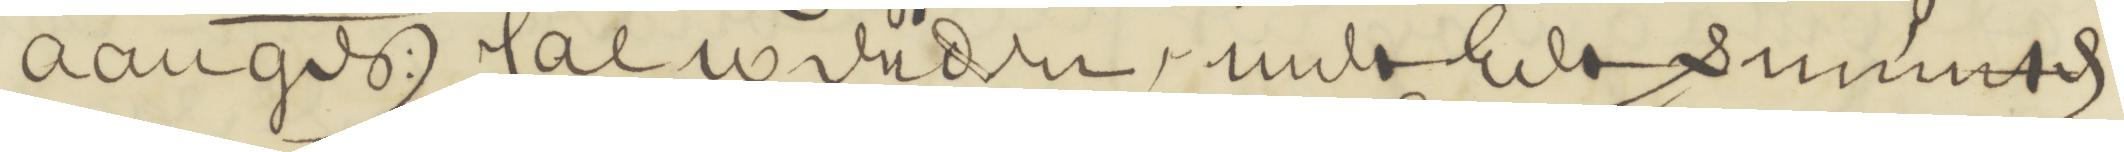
aanges: sal werden, met het vermunten
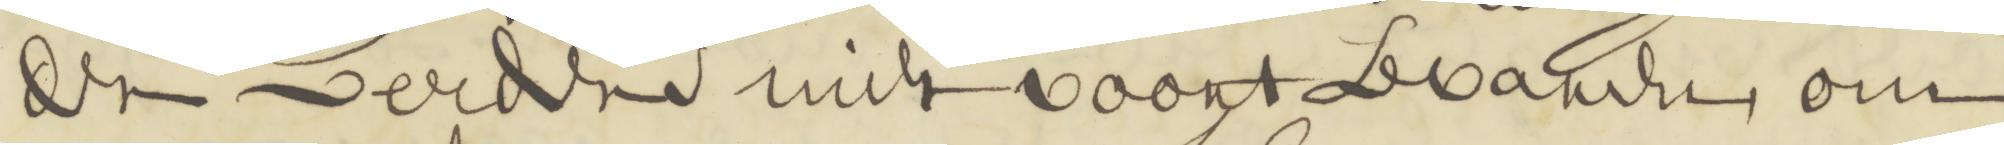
der verdere niet voort tevaren, om
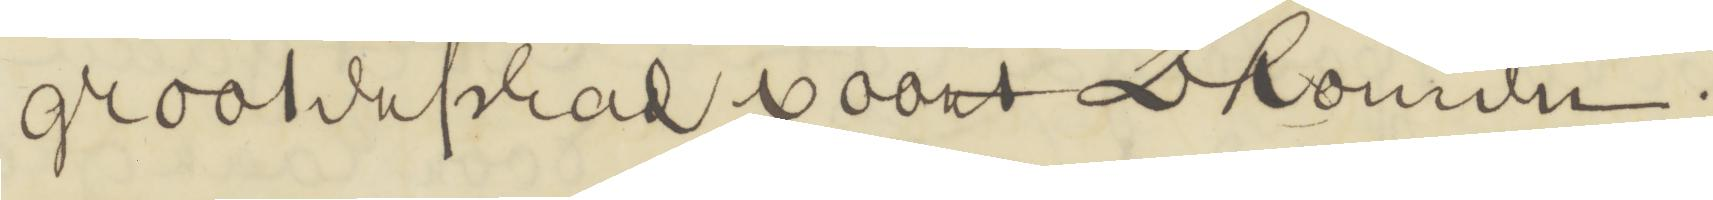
grooter schade voort tekomen.
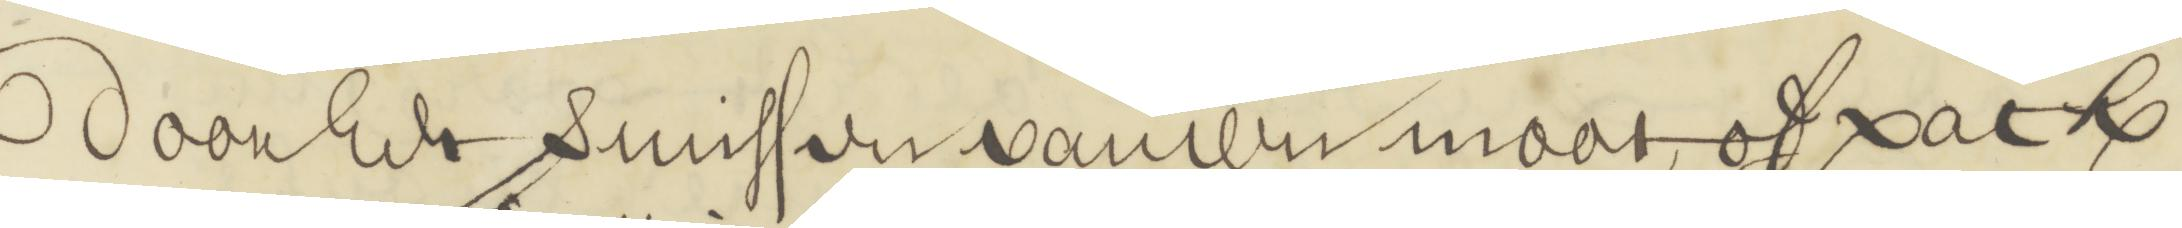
door het vermissen van een moot, of pack
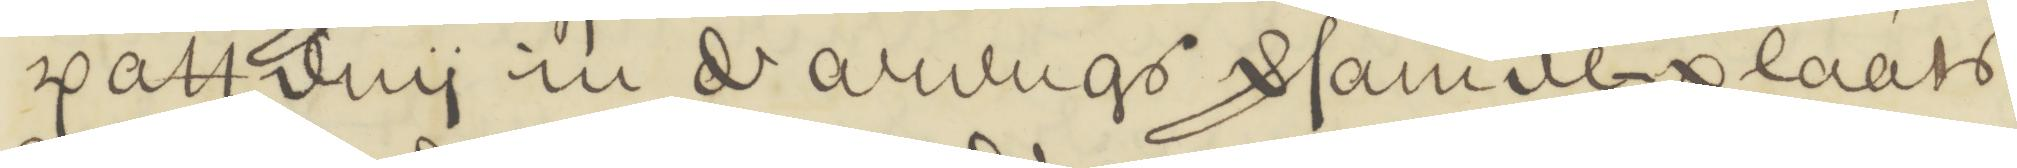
pattenij in de arengs versamel-plaats
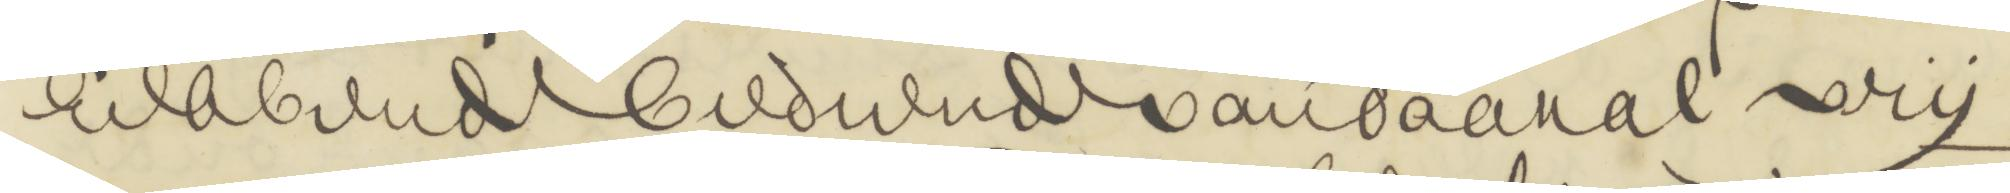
hebbende bediende van daaral vrij
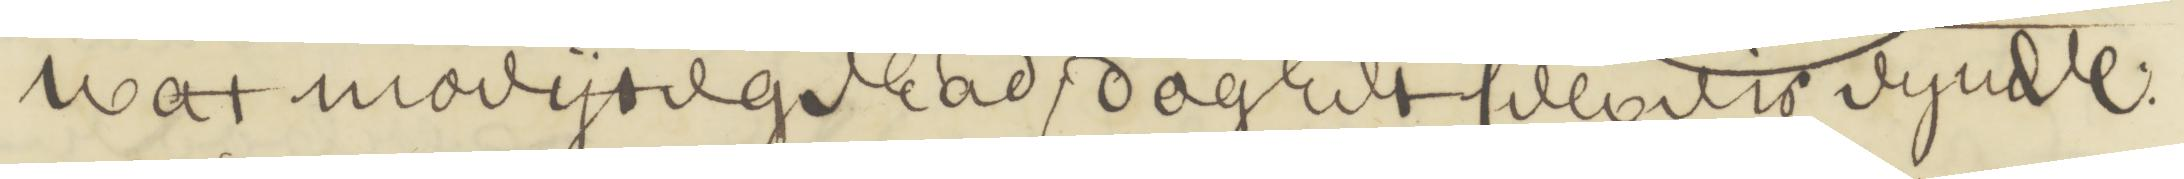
wat moeijte gehad, dog het selve is eijndelijk
